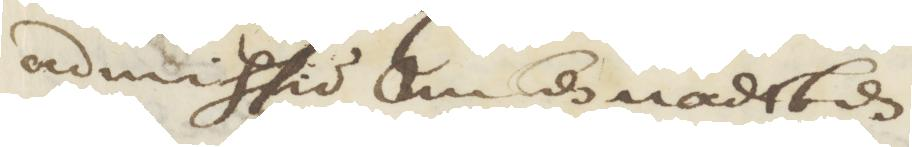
admissie om ten naesten
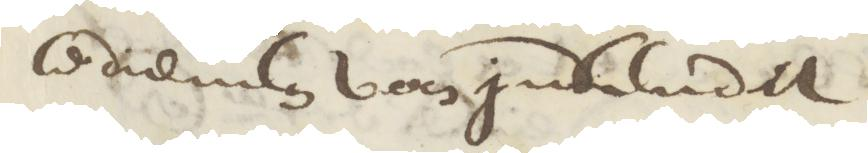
te dienen van jntendit
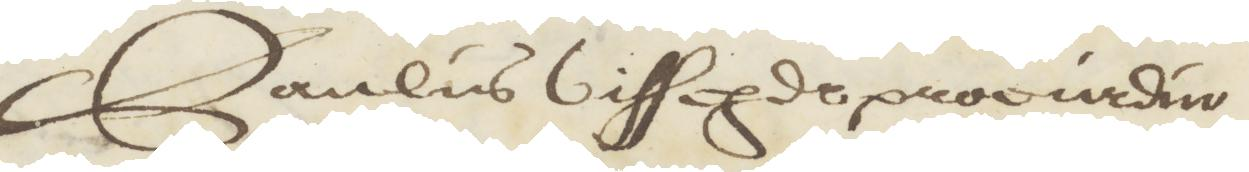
Paulus visscher procureur
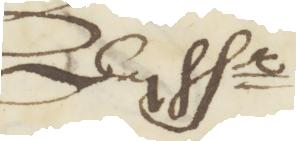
Eyss=r
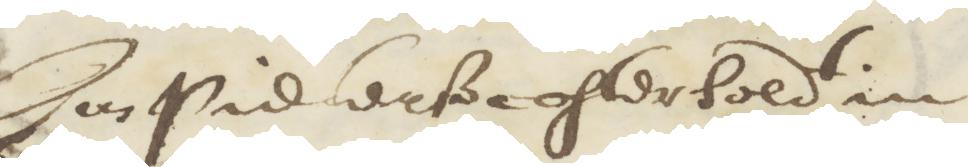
Jan pietersz coster soldt in
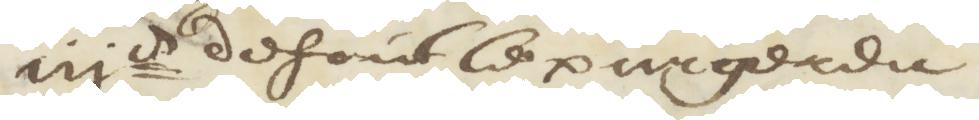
iij=e defout te purgeren
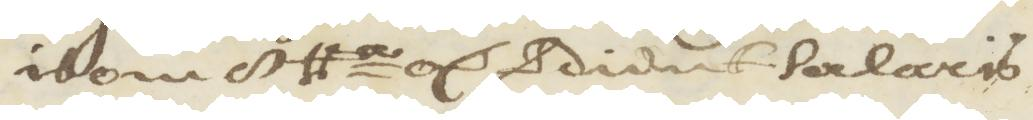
item 8 R=a over verdient salaris
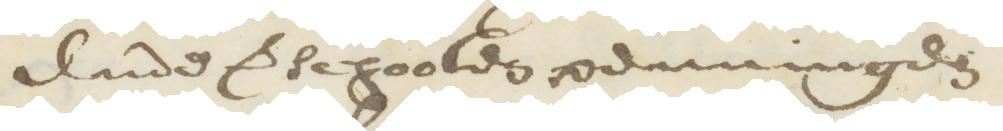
Ende verschooten penningen
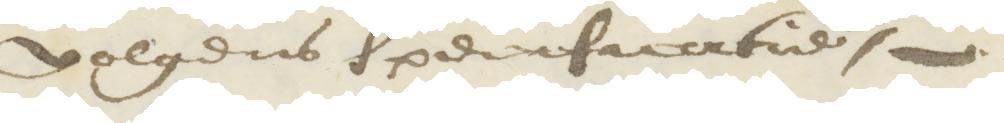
volgens speceficatie, —.
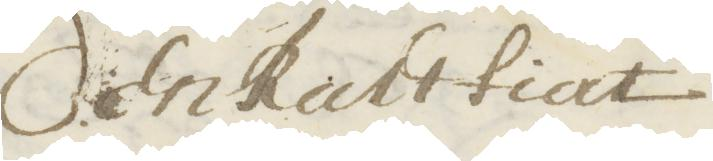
den Raet fiat
